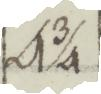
4¾
